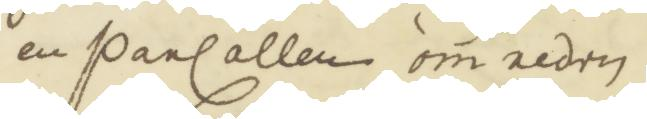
en parcallen om reden
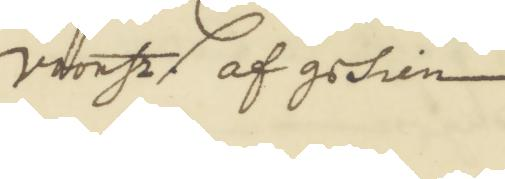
voorsz: af gesien
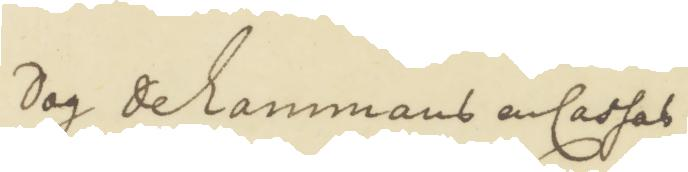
dog de hammans en Cassas
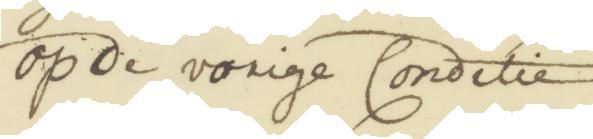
op de vorige conditie
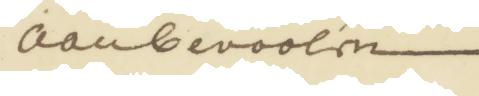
aanbevoolen
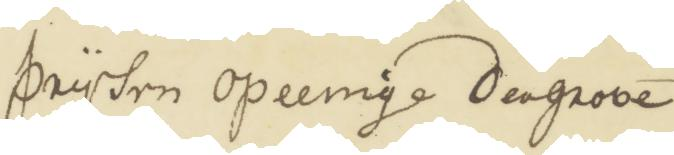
prijsen op eenige der grove
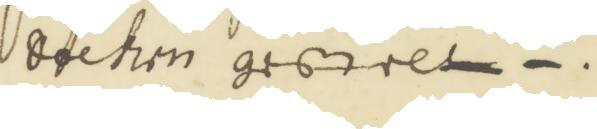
doeken gestre-.
